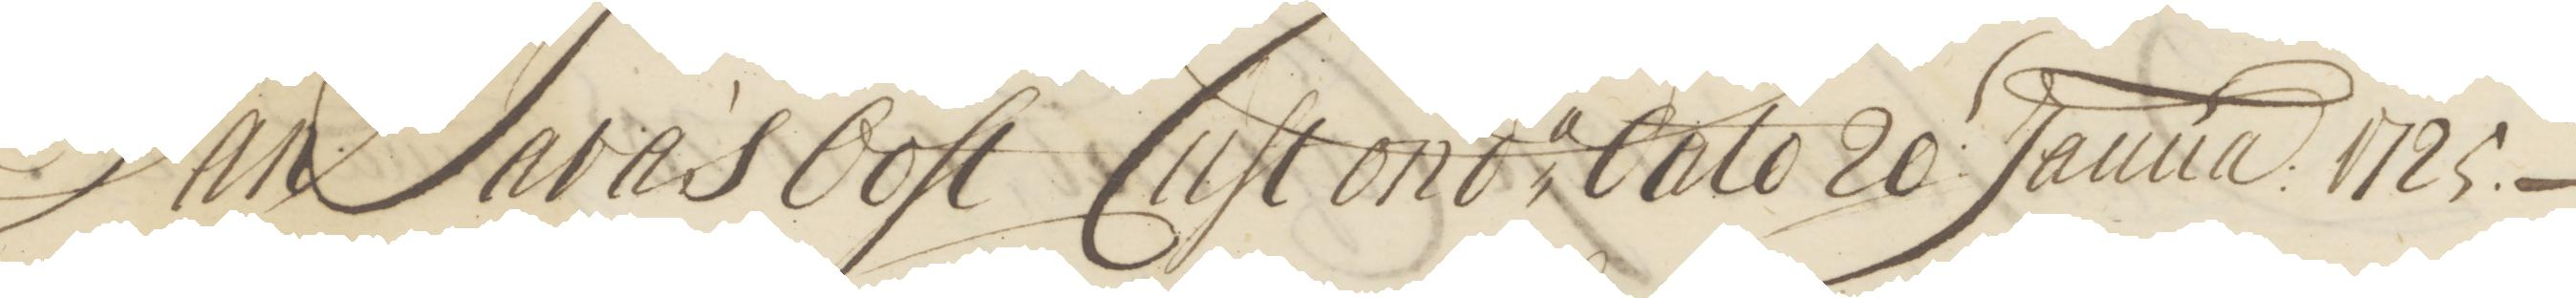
Van Iava's Oost Cust ond„r dato 20:' Janua: 1725. —
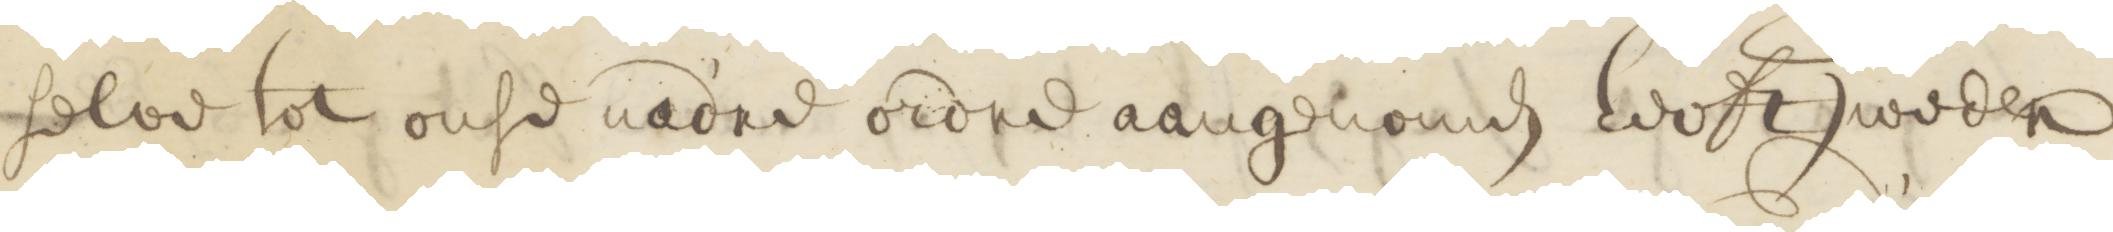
selve tot onse nad're ordre aangenomen heeft) weder
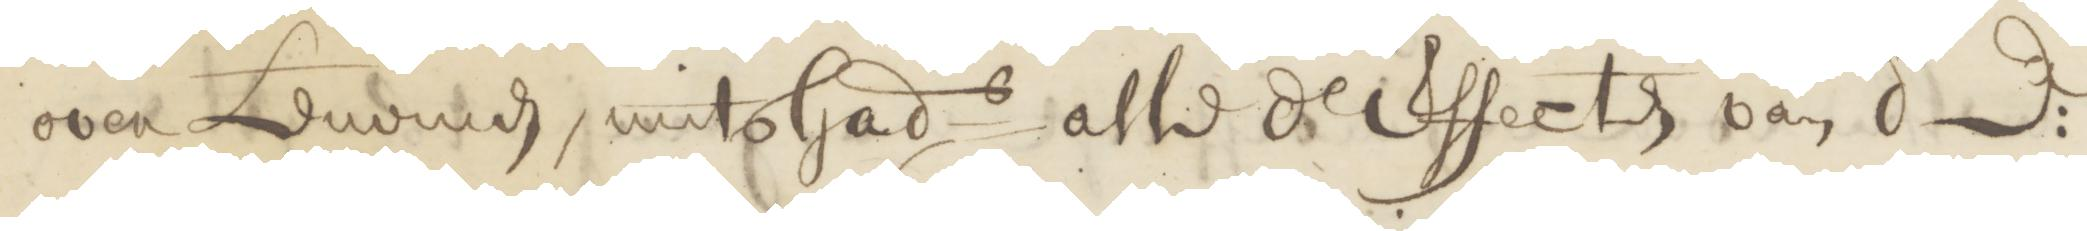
over te nemen, mitsGad=s alle de Effecten van d'E:
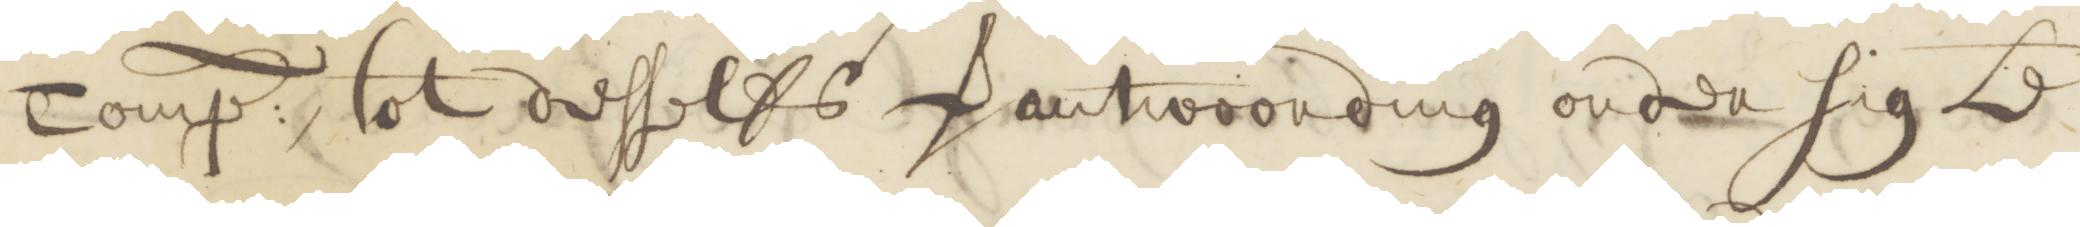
Comp:, tot desselfs verantwoording onder sig te
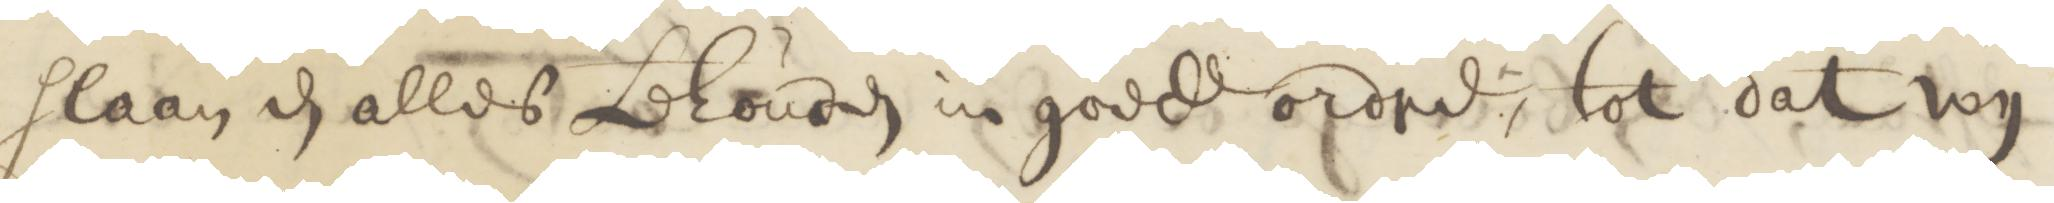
slaan en alles te houden in goede ordre, tot dat wij
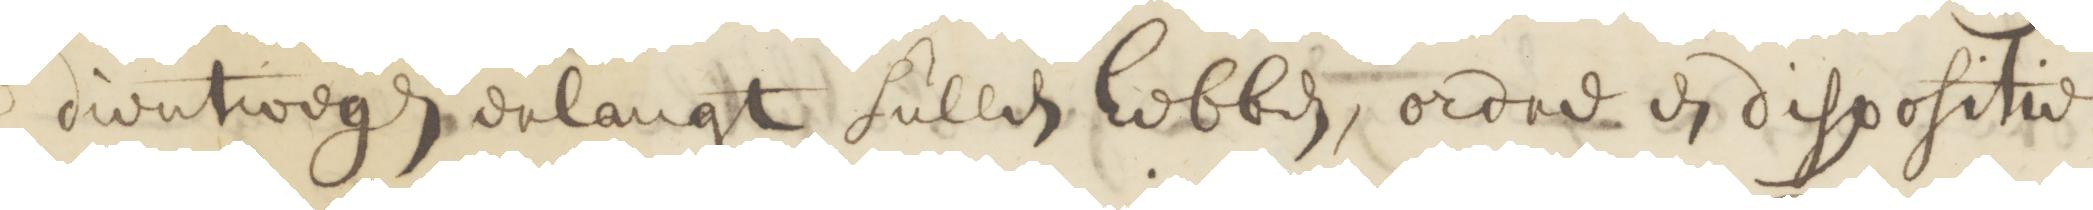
dientwegen erlangt sullen hebben, ordre en dispositie
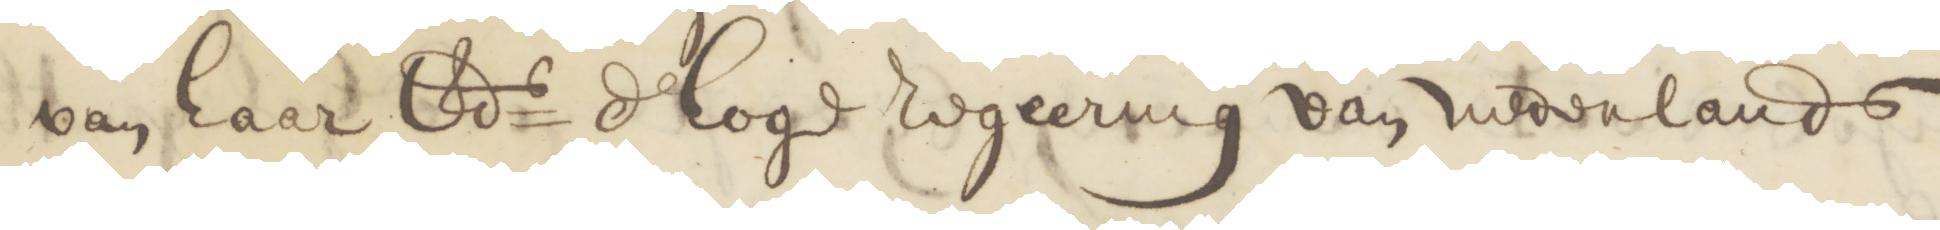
van haar Ed=s d hoge Regeering van Nederlands
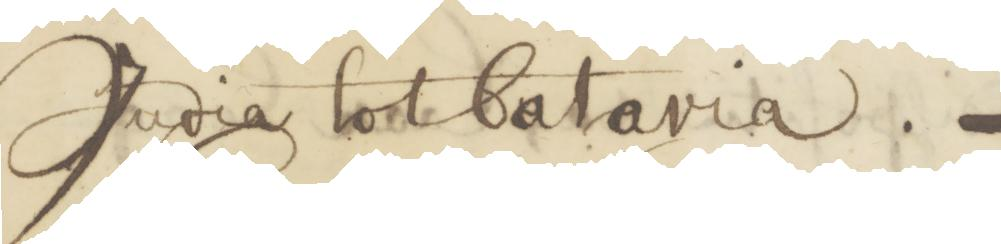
Jndia tot batavia. —
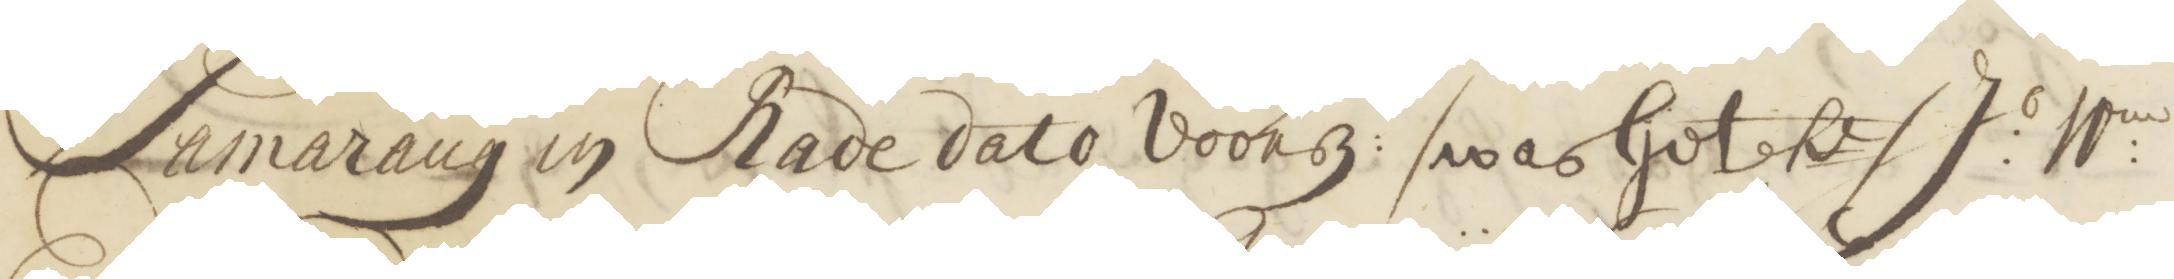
Samarang in Rade dato Voorsz: / was Getek=t / J:o W:m
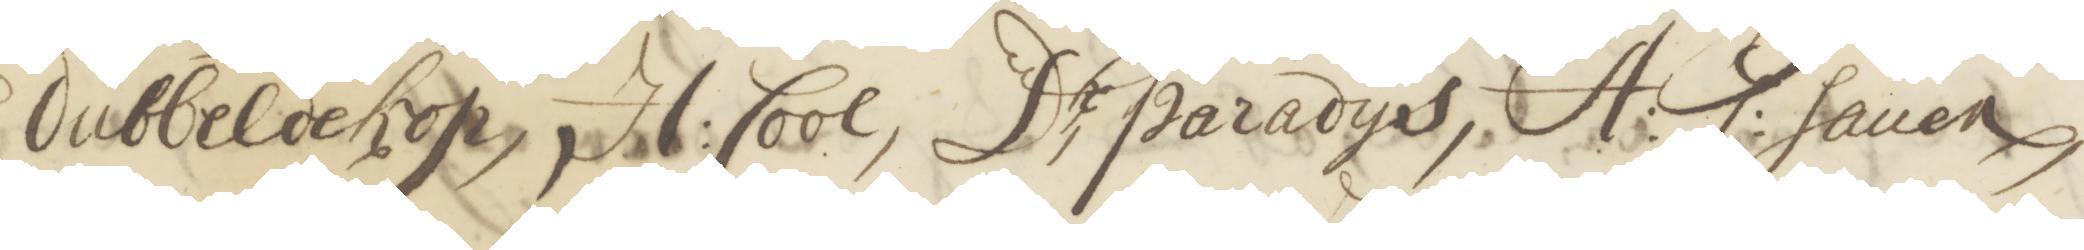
Dubbelde kop, H: Cool, D„r Paradijs, A: J: sauer,
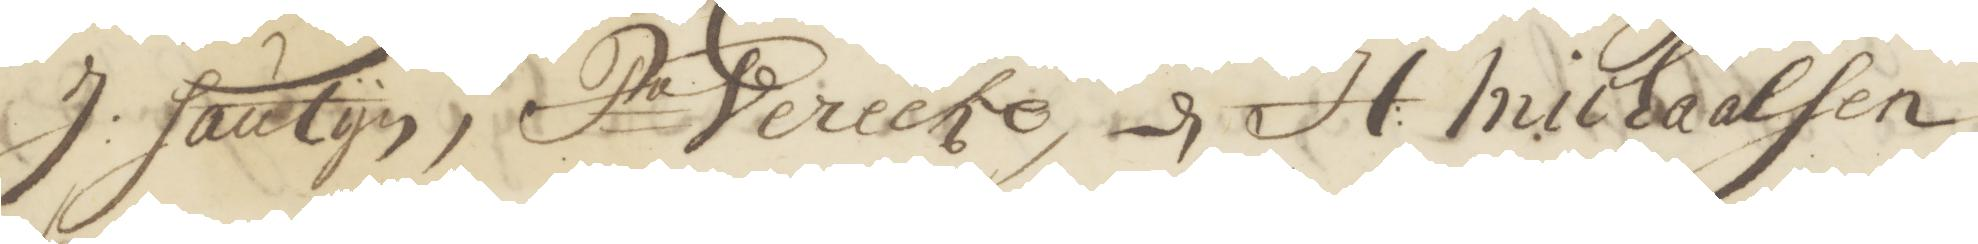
J: sautijn, P=r Vereeke, en H: Michaalsen
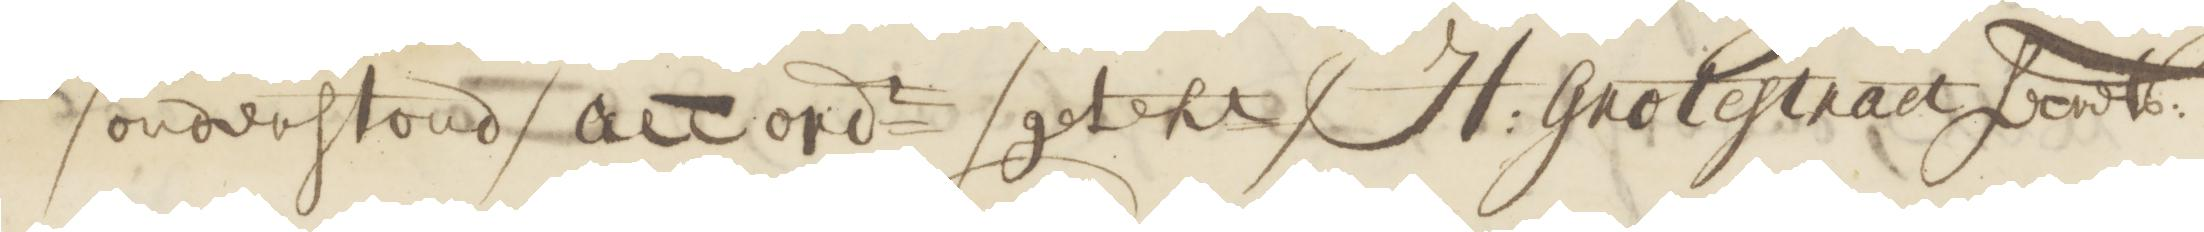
/ onderstond / accord=t / getek=t / H: Grotestraet secrets:
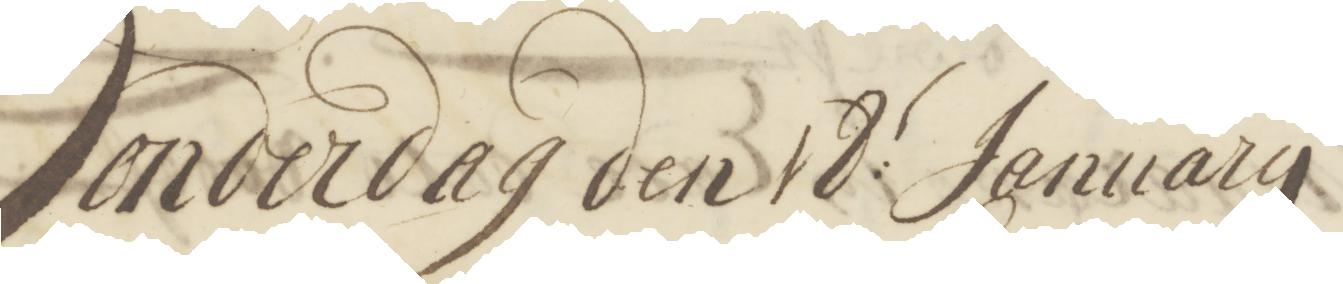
Donderdag den 18:' Januarij
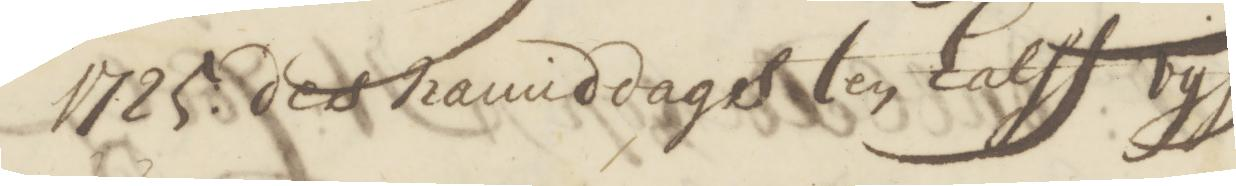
1725: des Namiddags ten halff vijff
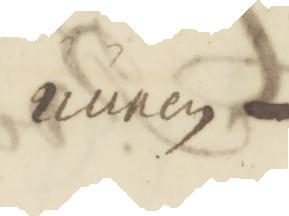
uuren —
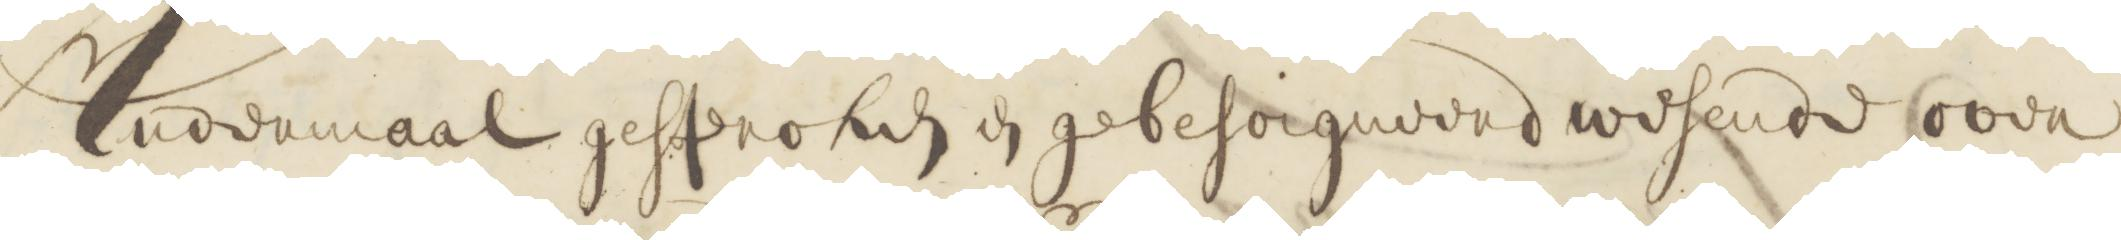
Andermaal gesproken en gebesoigneerd wesende over
